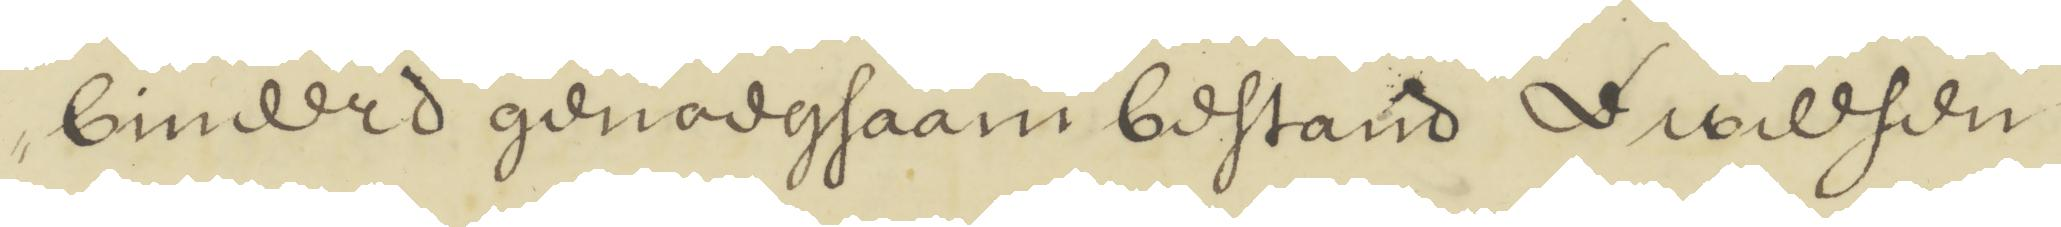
„bineerd genoegsaam bestand te weesen
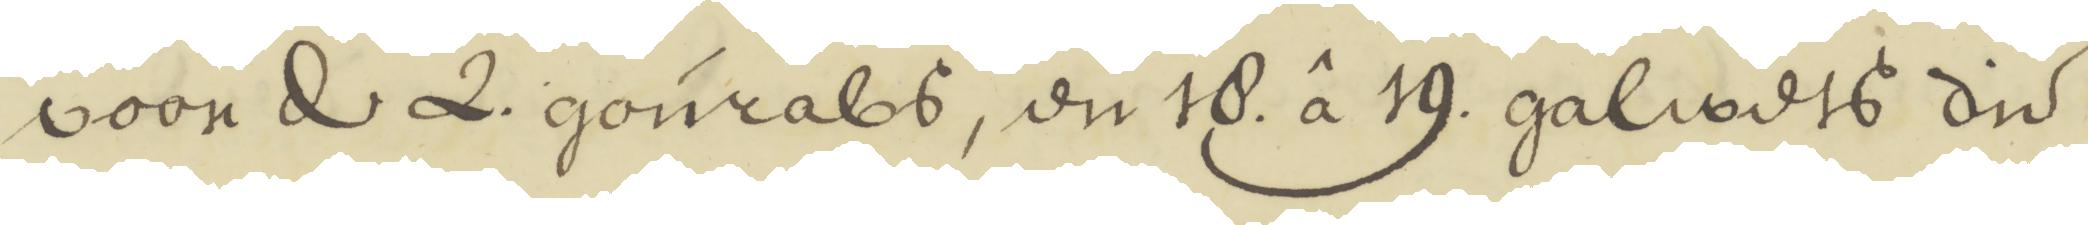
voor de 2. gourabs, en 18. â 19. galwets die
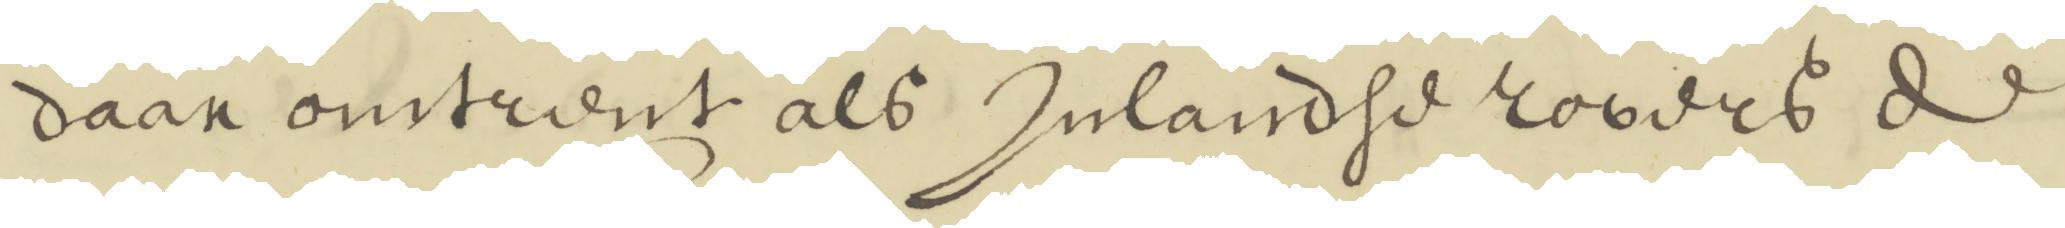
daar omtrent als Jnlandse rovers de
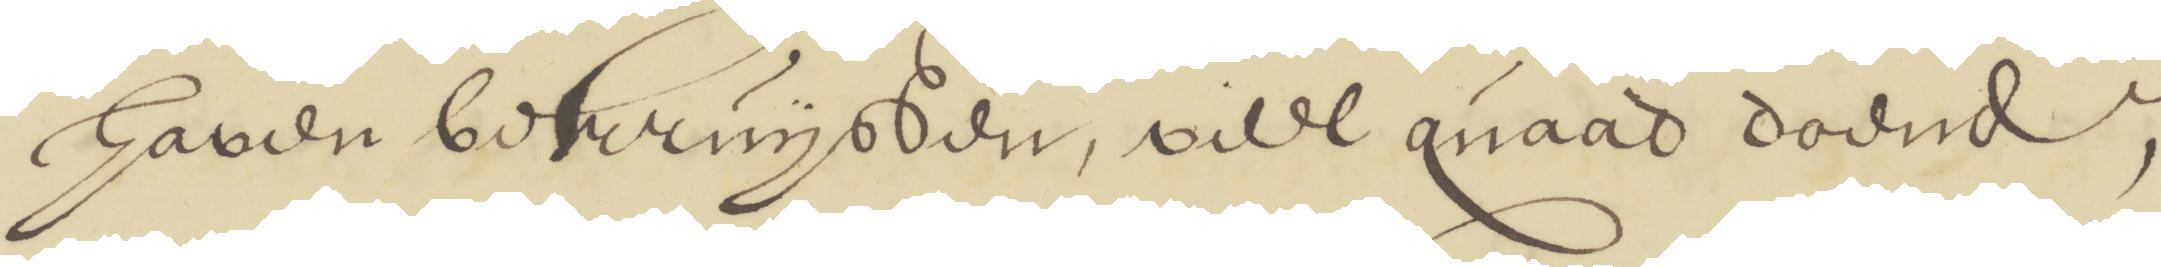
haven bekruijssen, veel quaad doende
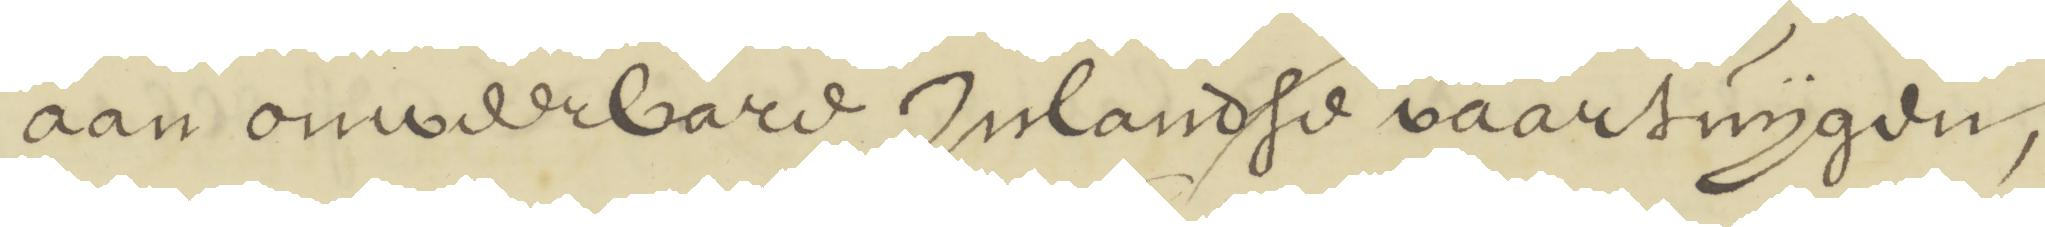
aan onweerbare Jnlandse vaartuijgen,
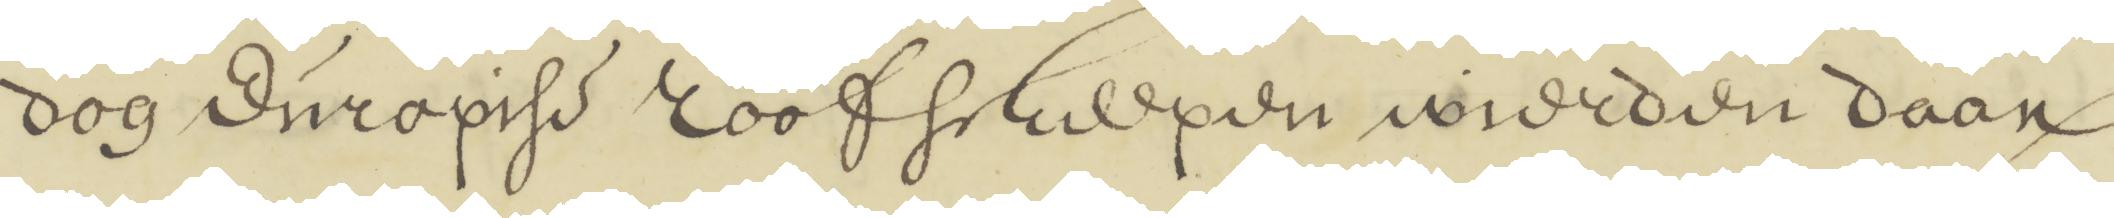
dog Europise roofscheepen wierden daar
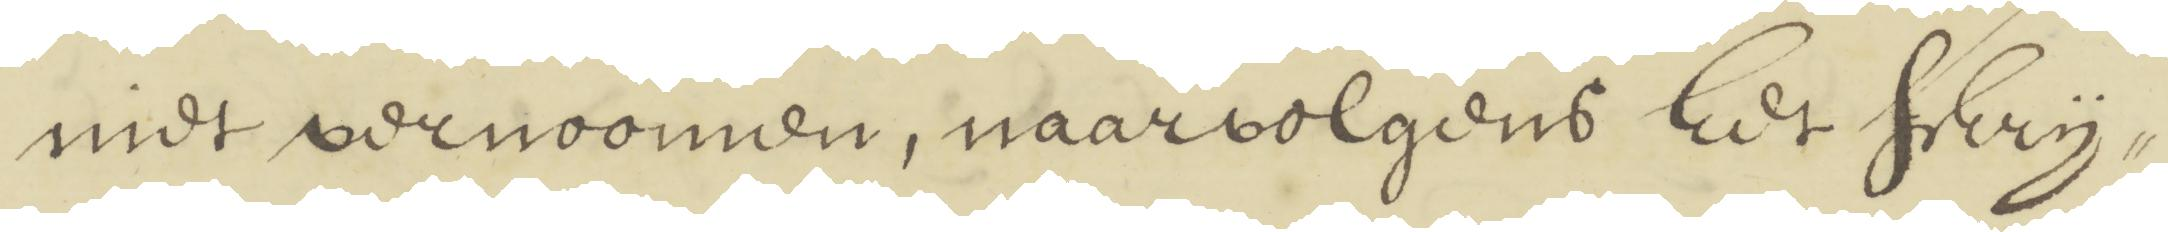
niet vernoomen, naarvolgens het schrij„
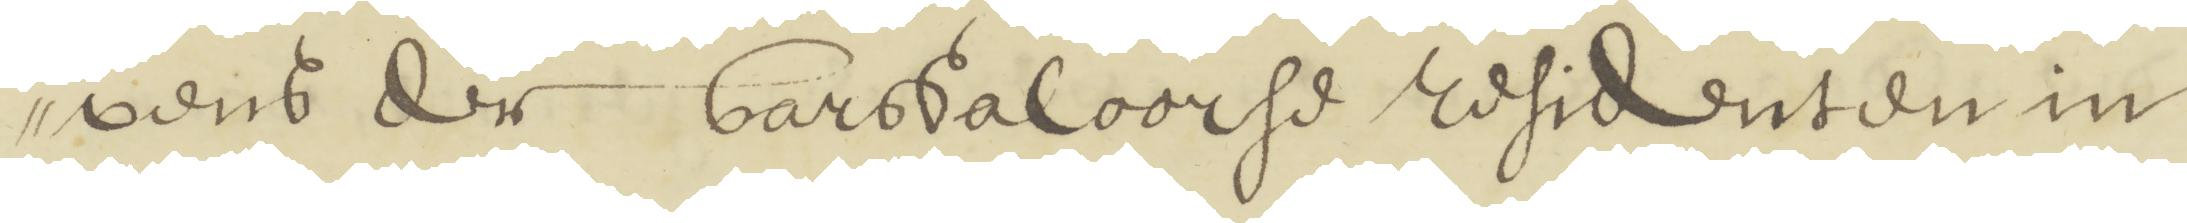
„vens der barssaloorse residenten in
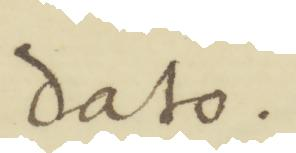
dato.
